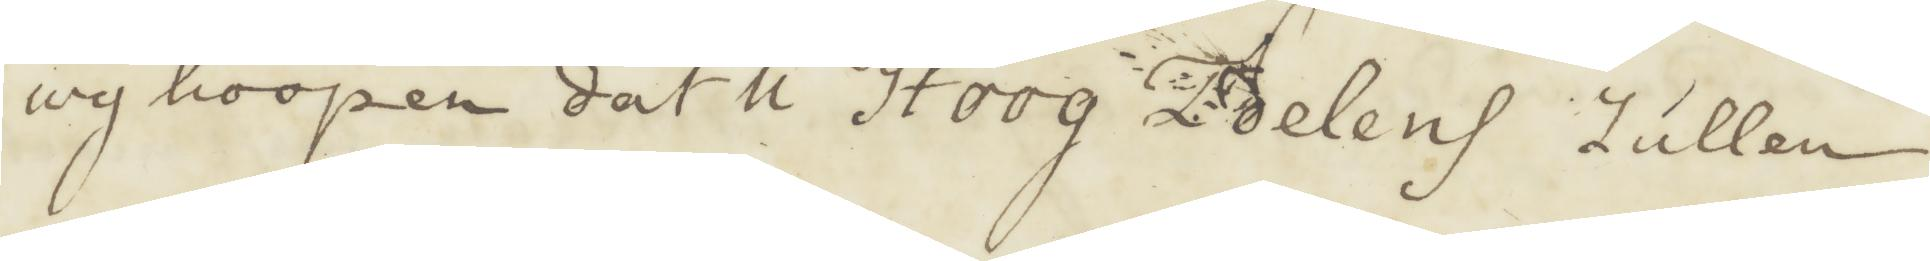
wy hoopen dat u Hoog Edelens zullen
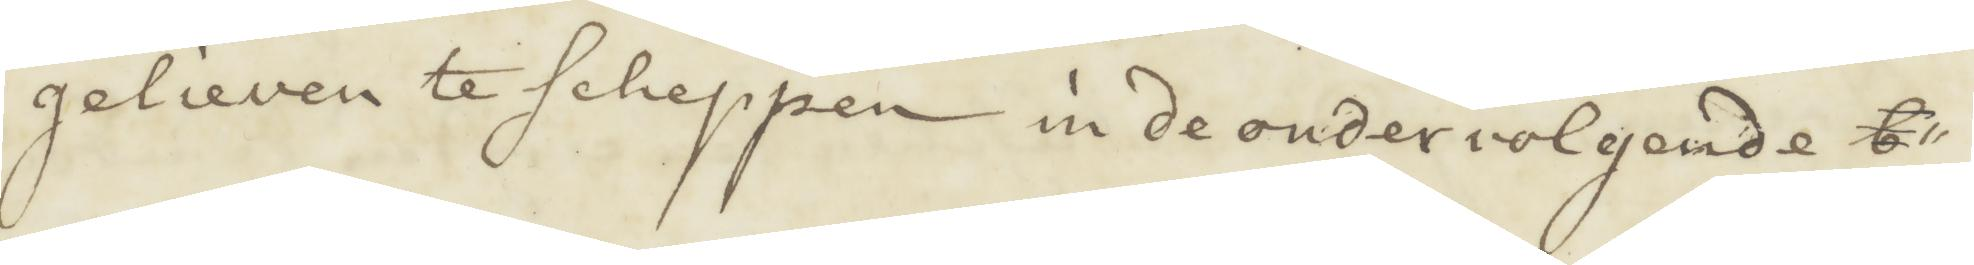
gelieven te scheppen in de ondervolgende b„
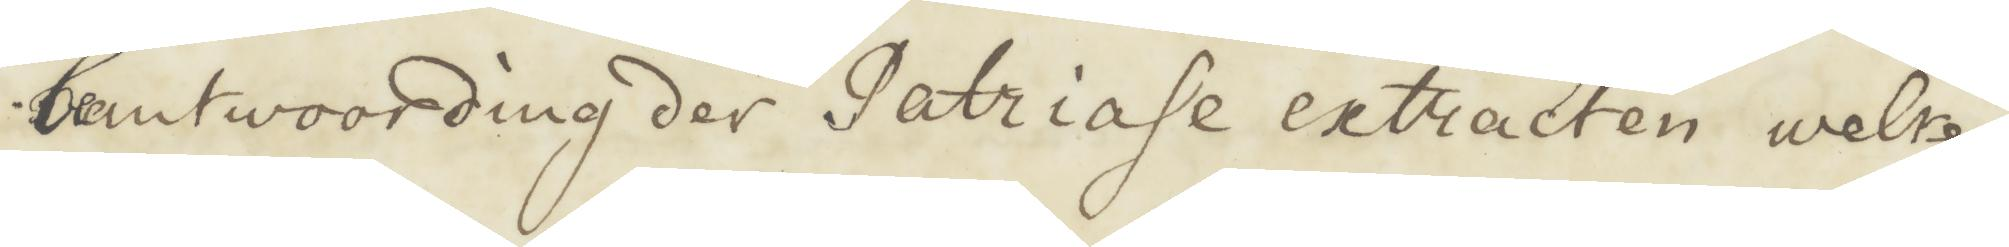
beantwoording der Patriase extracten welke
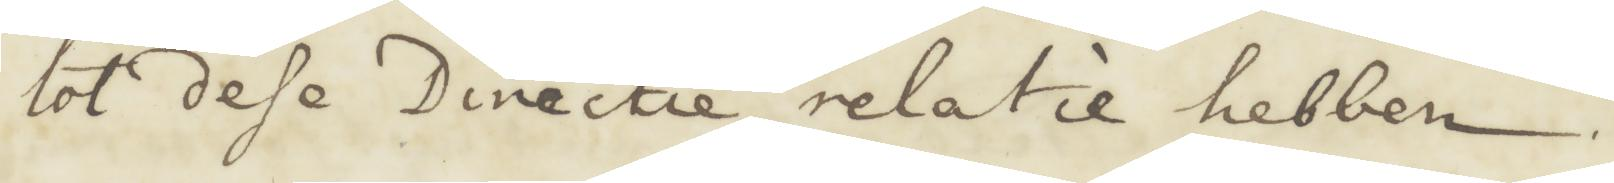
tot dese Directie relatie hebben.
